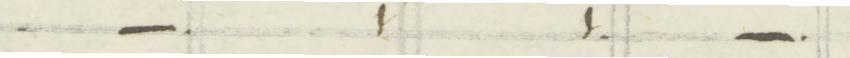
—. 1 1. —.
